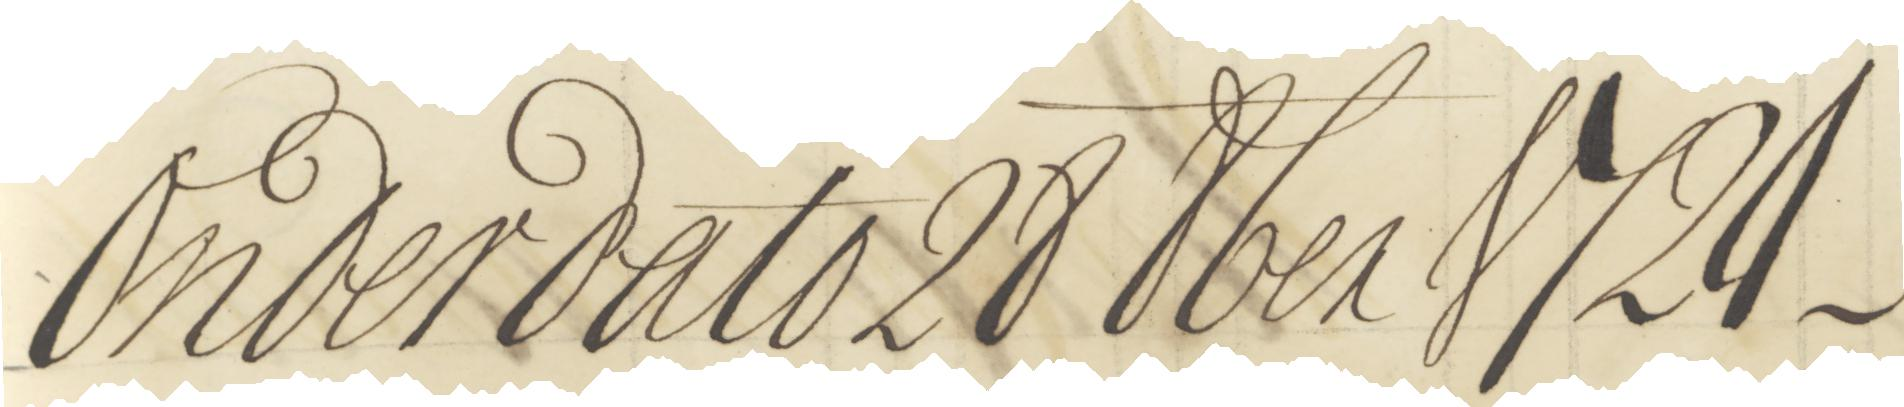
Onder dato 28 8ber 1724 _
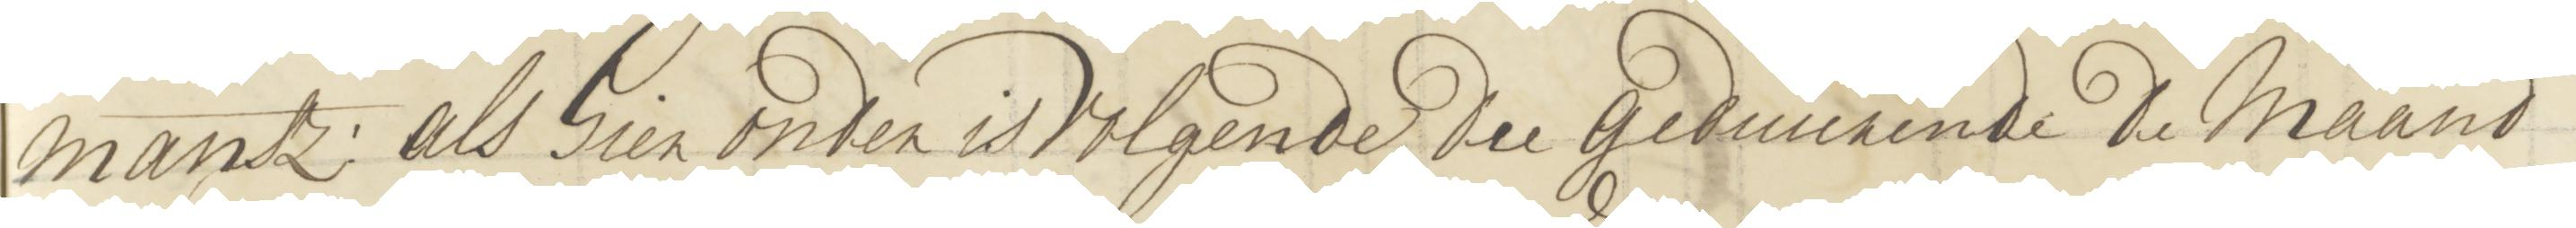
mansz: als hier onder is volgende die geduurende de maand
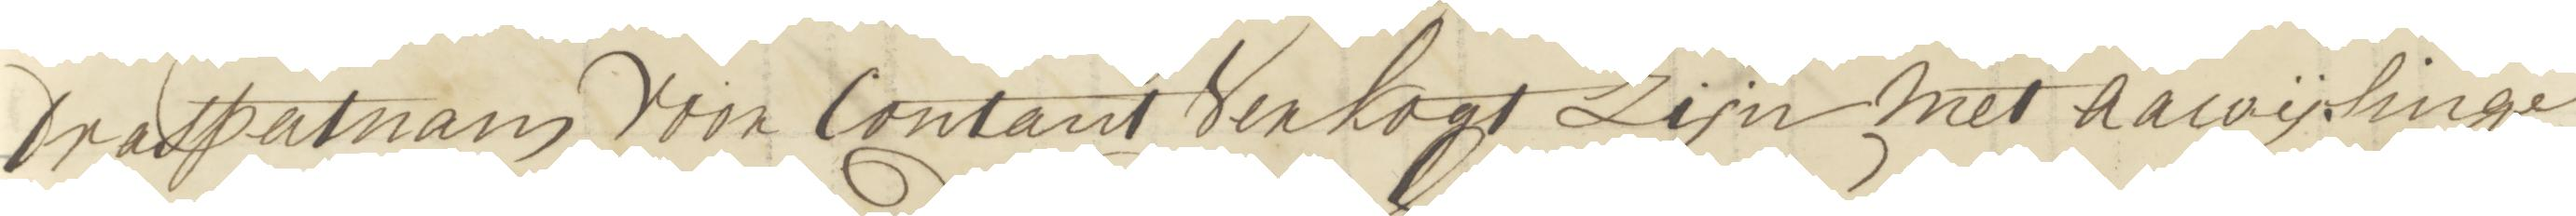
draspatnam voor Contant verkogt zijn met aawijsinge
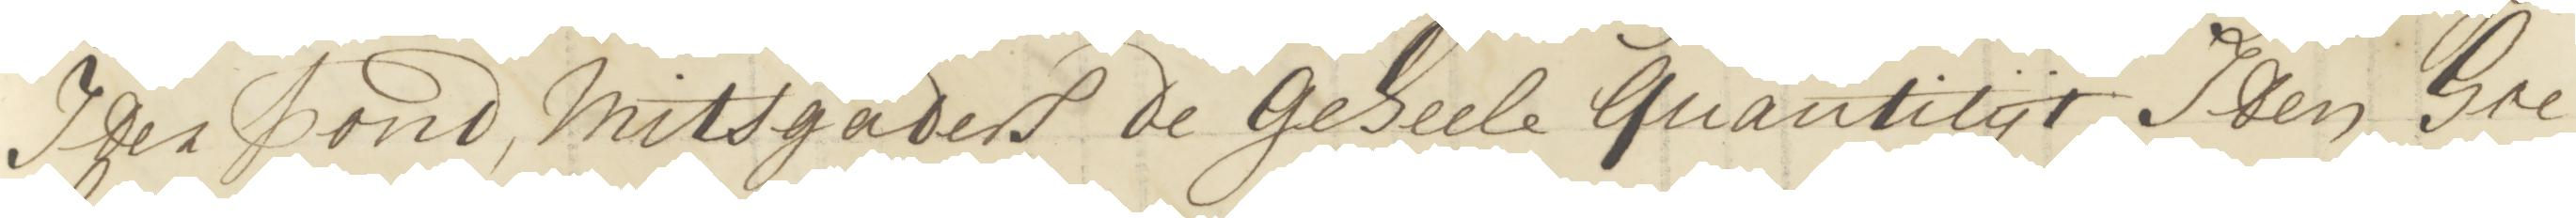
Ider pond, mitsgaders de geheele quantitijt Iden hoe
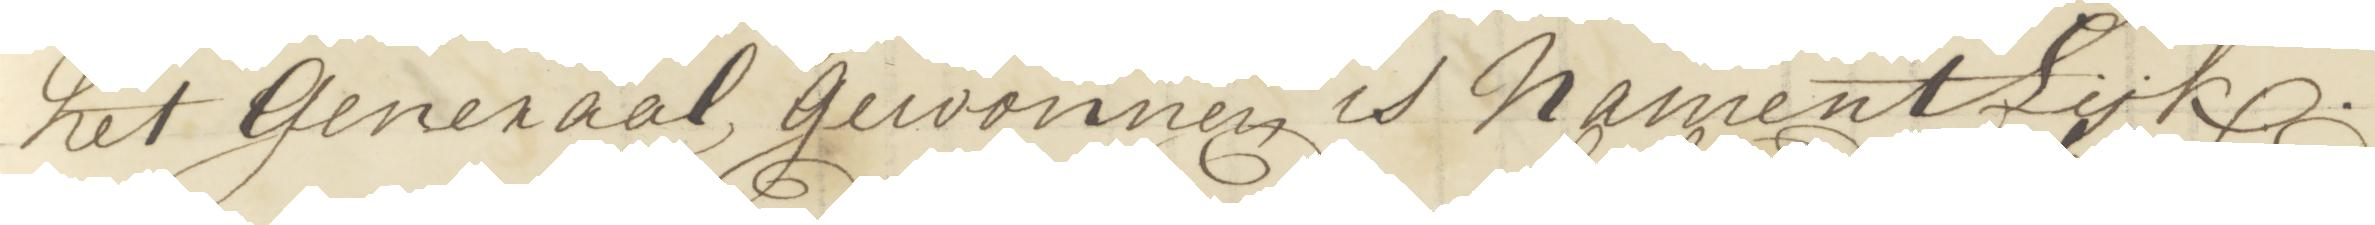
het Generaal gewonnen is namentlijk.
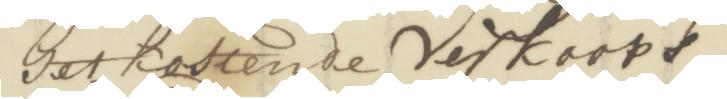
het kostende verkoops
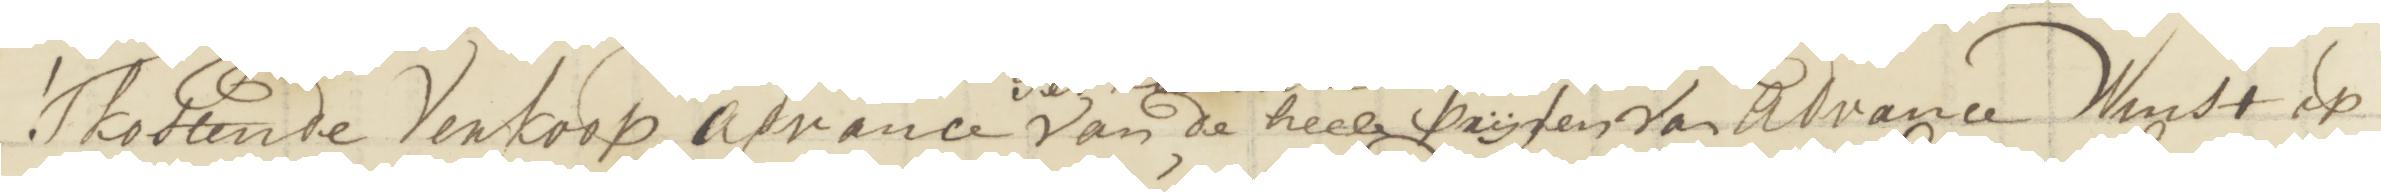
'T kostende Verkoop advance van de heele prijsen van advance Winst op
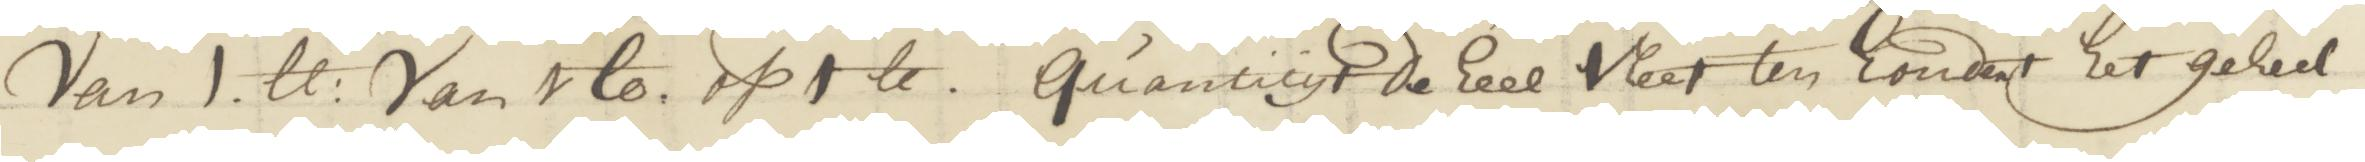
van 1. lb: van 1 lb. op 1 lb. quantityt de heel Vleet ten hondert het geheel
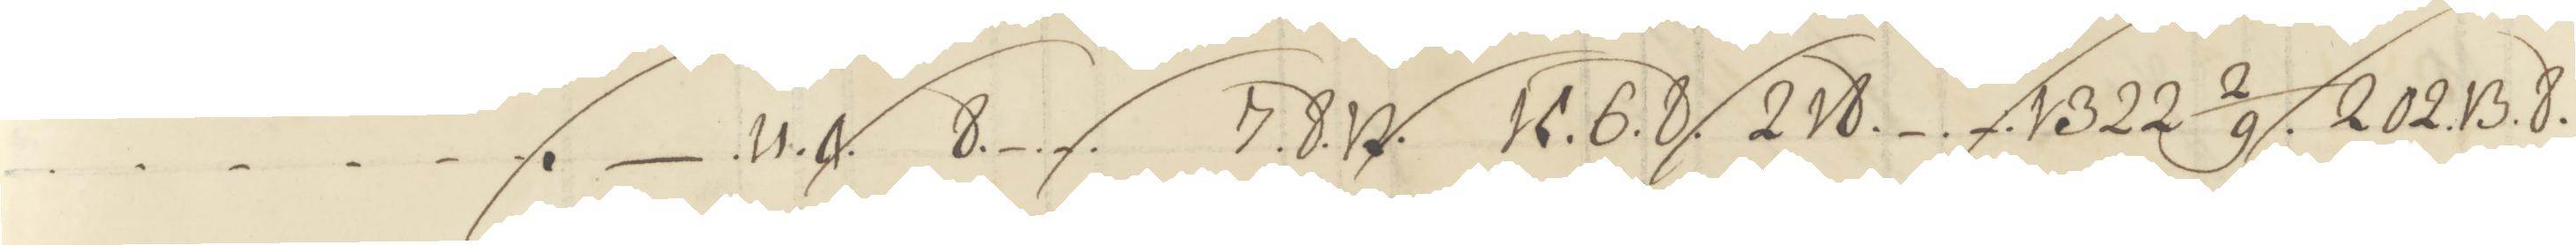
. . - - - ƒ —.11.4. ƒ 8.-.ƒ 7.8.1 ƒ 15.6.8 ƒ 218.-. ƒ 1322 2/9 ƒ 20213.8
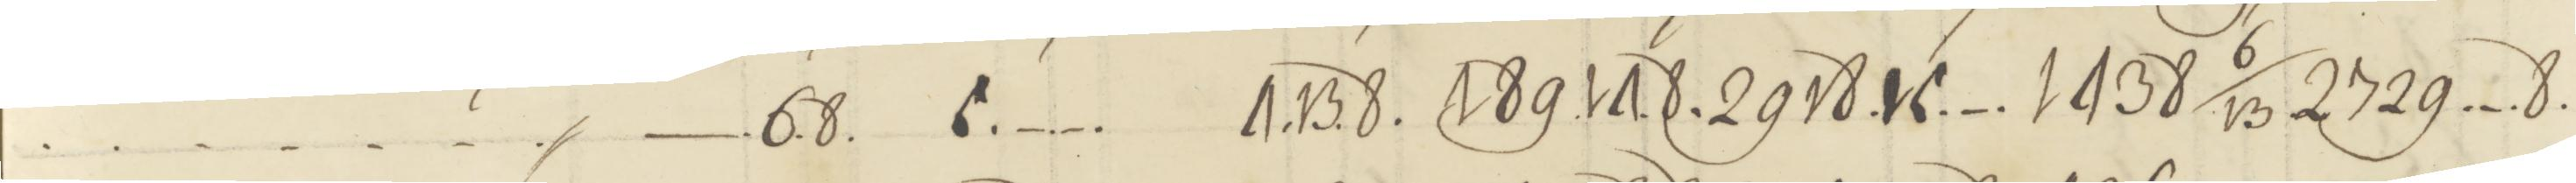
. . . - - - .„ —.6.8. 5.-.-. 4.13.8. 189.14.8. 2918.15.-. 1438 6/13 2729.-.8
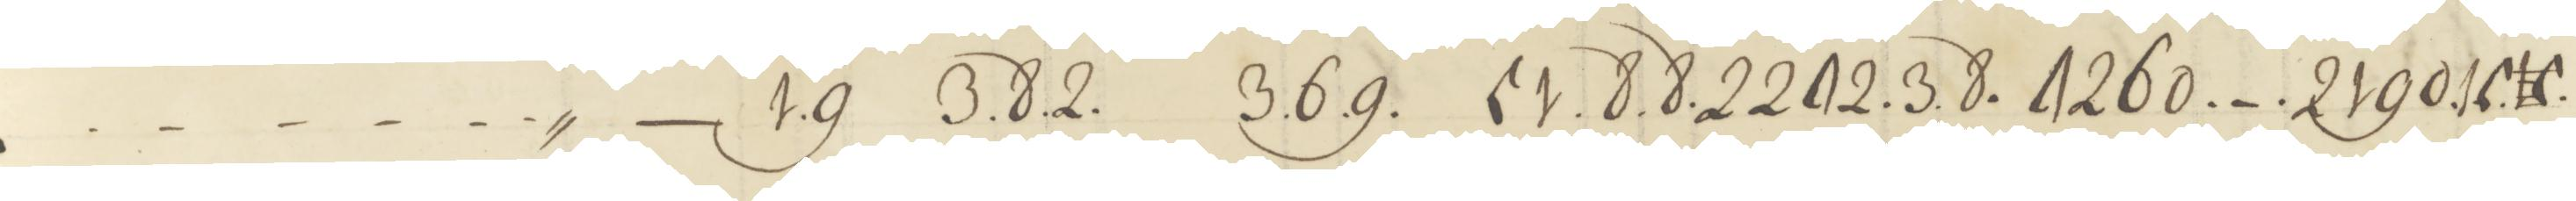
- - - - - - „ — 1.9 3.8.2. 3.6.9. 51.8.8. 2242.3.8. 4260.-. 2190.15.15.
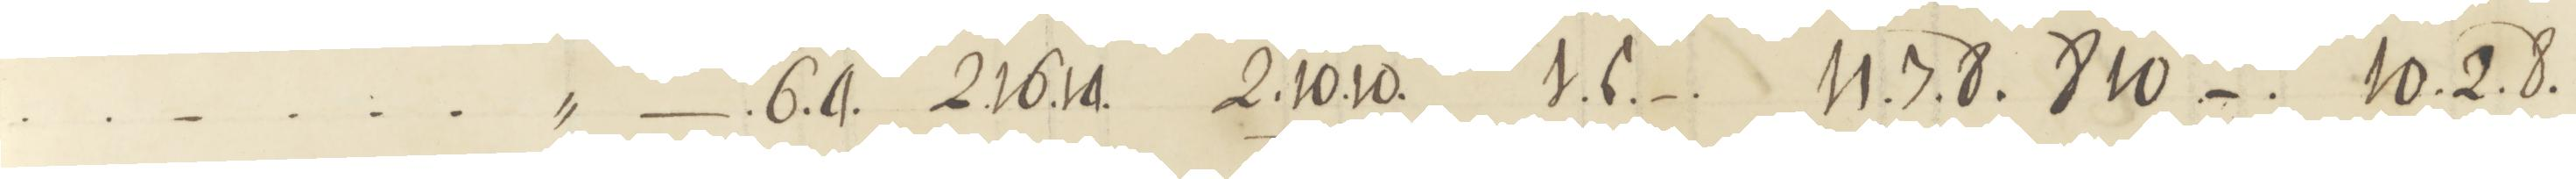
. . - . . . „ —.6.4. 216.14. 2.10.10. 1.5.-. 11.7.8. 810.-. 10.2.8.
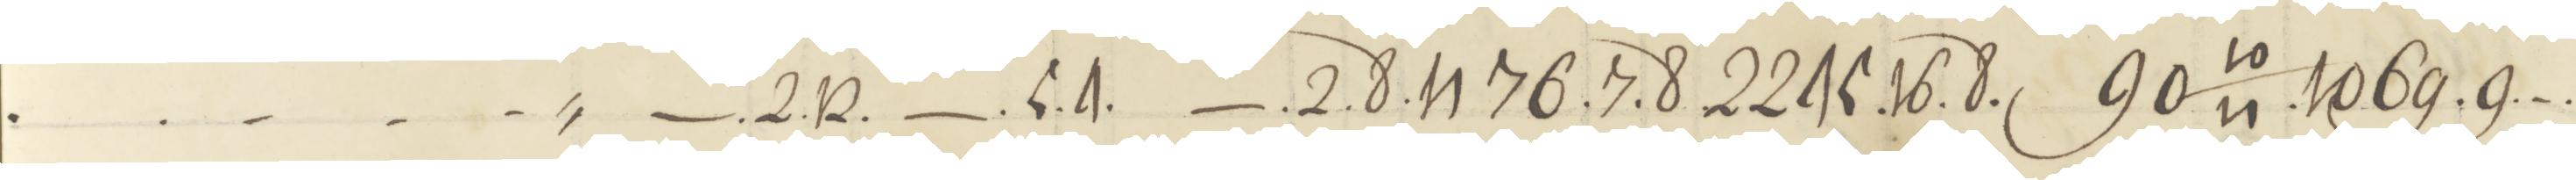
. . - - - „ —.2.12. —.5.4. —.2.8.1176.7.8 2245.16.8. 90 10/11. 1069.9.-
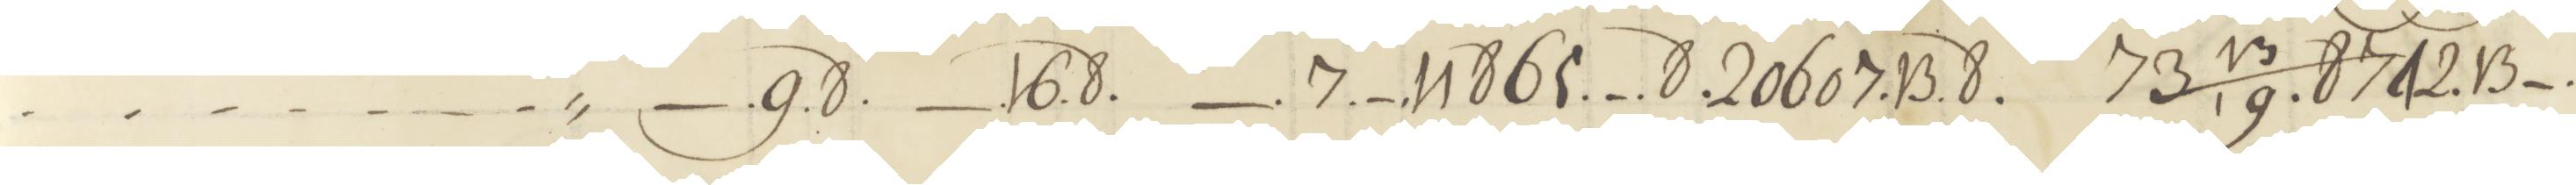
- - - - - - - - „ —.9.8. —16.8. —.7.-.11865.-.8.20607.13.8. 73 13/19.8742.13-
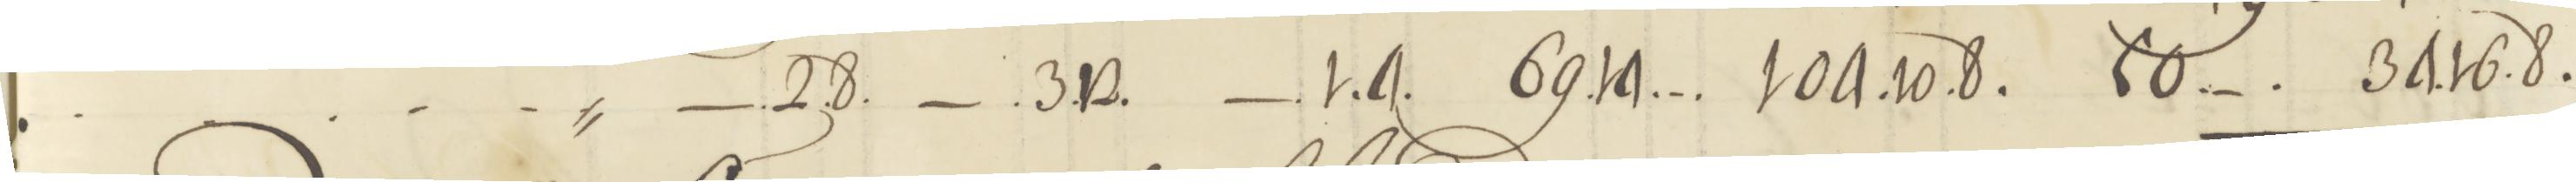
. - - - - - „ —. 28. — . 3.12. —.1.4. 69.14.-. 104.10.8. 50.-. 34.16.8
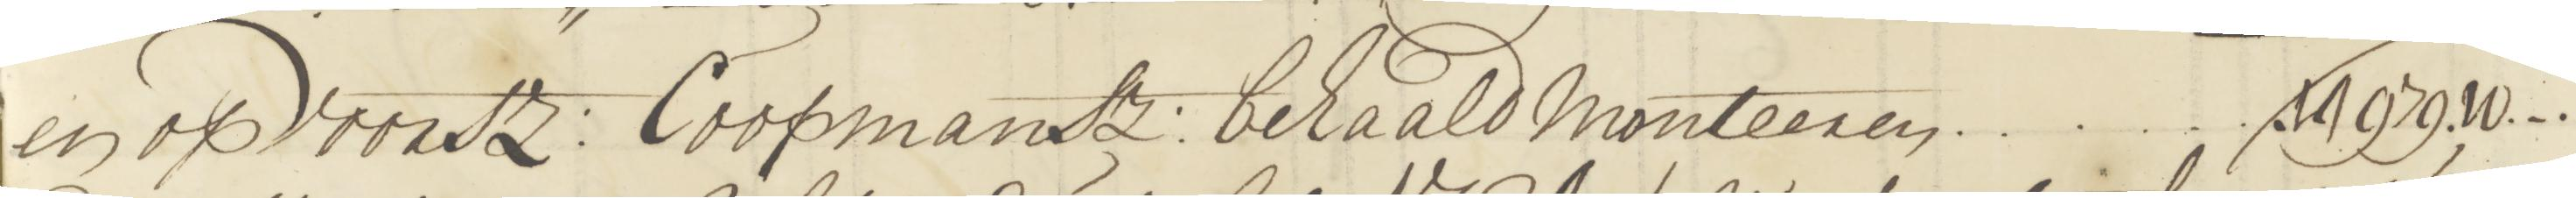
en op voorsz: Coopmansz: behaald monteeren. . . . . . ƒ14979.10.-
